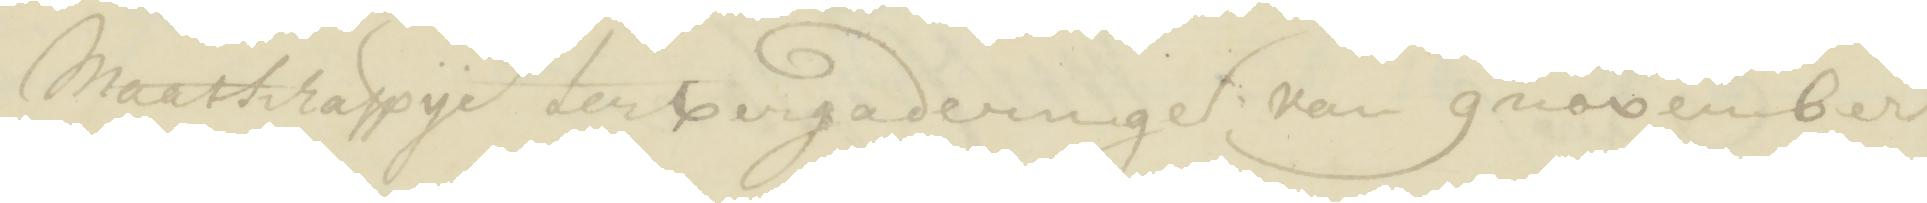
Maatschappije ter vergaderinge van 9 november
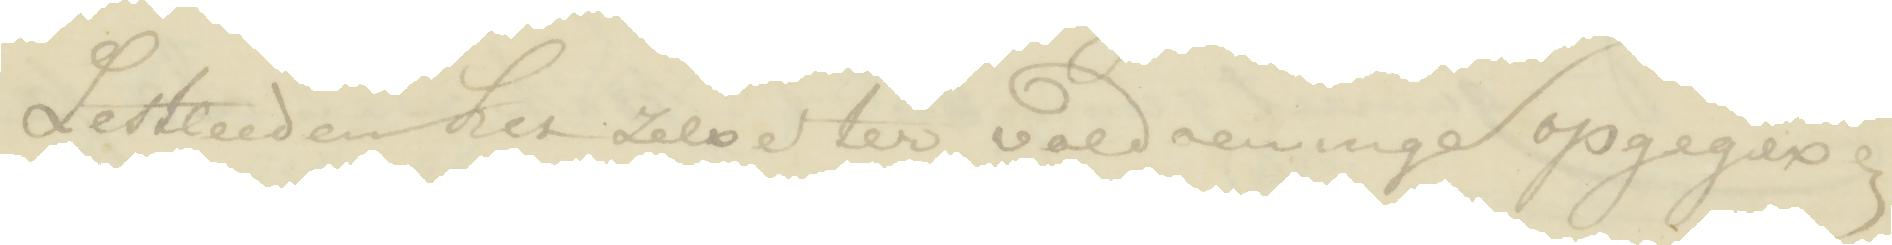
Lestleeden het zelve ter voldoeninge opgegeven
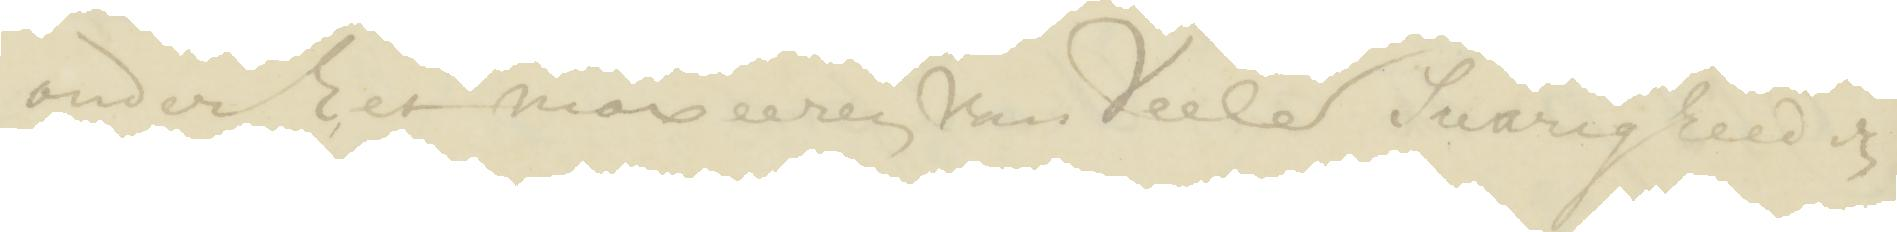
onder het maxeeren van veele suarigheed en
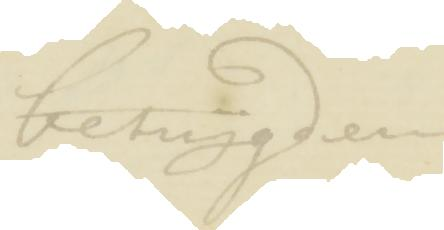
betuygden
